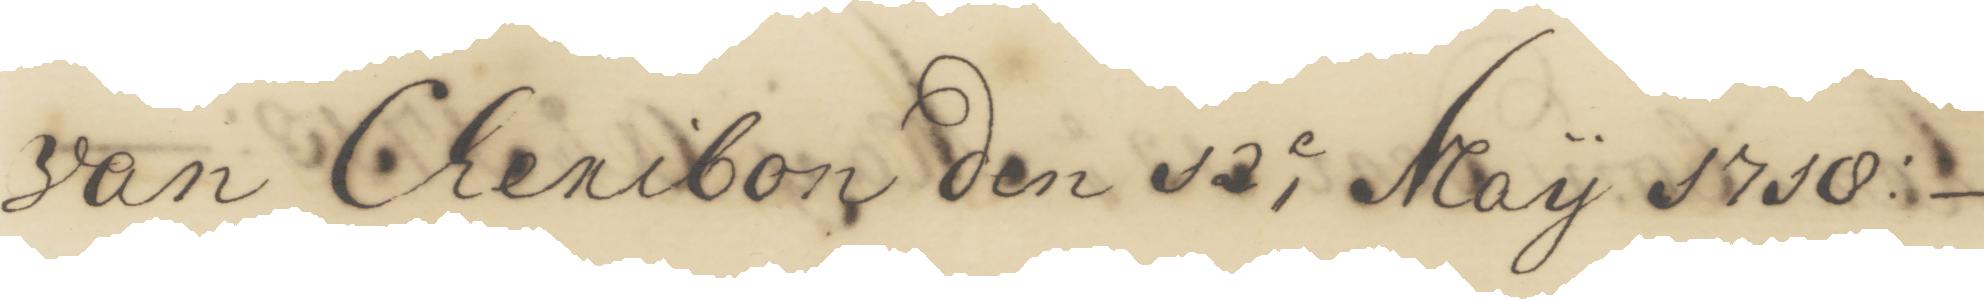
van Cheribon den 12„e Maij 1718: —
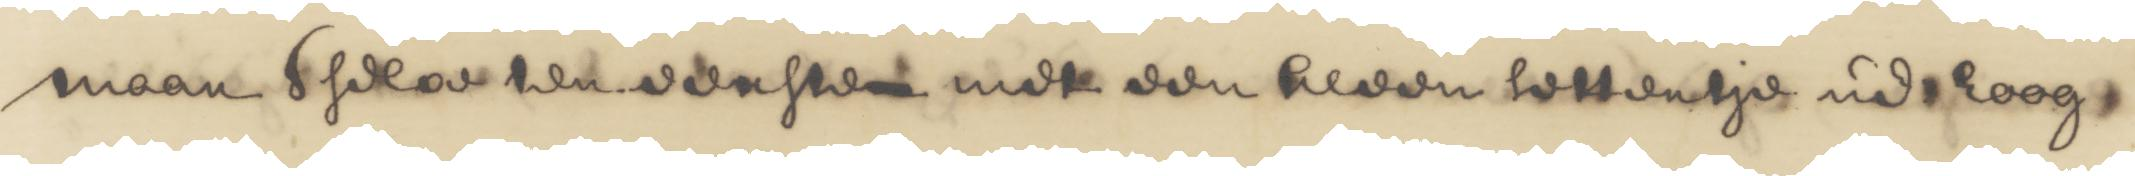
maar 't selve ten eersten met een kleen settertje uE hoog
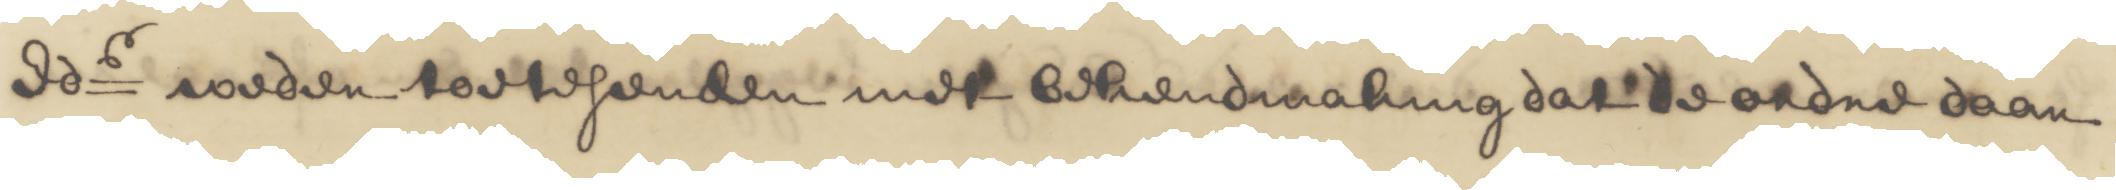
Ed=s weder toe te senden met bekendmaking dat de ordre daar
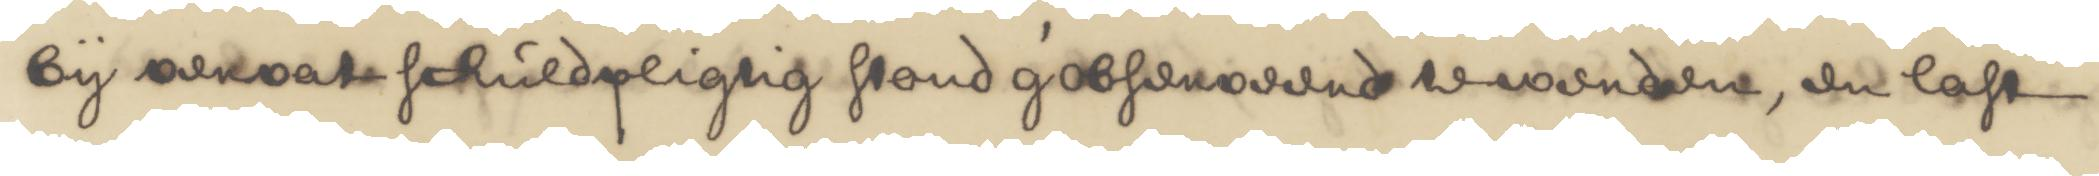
bij vervat schuldpligtig stond g'observeerd te werden, en last
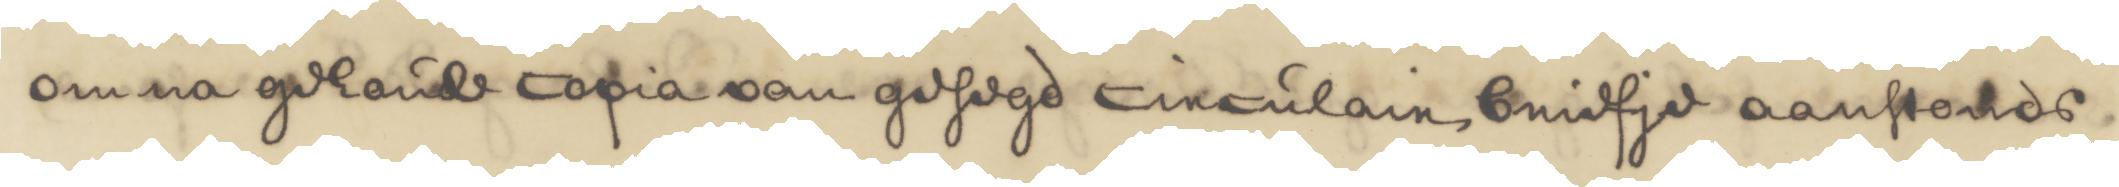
om na gehoude copia van gesegd circulair briefje aanstonds
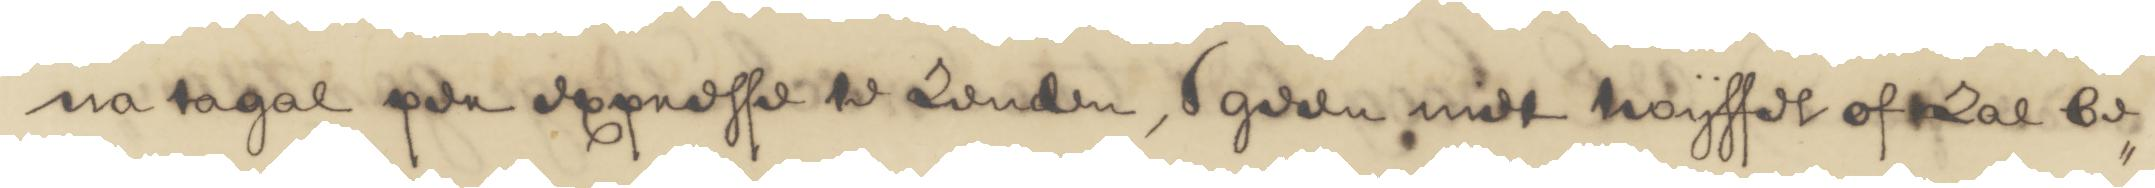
na tagal per expresse te Zenden, 't geen niet twijffel oft Zal be„
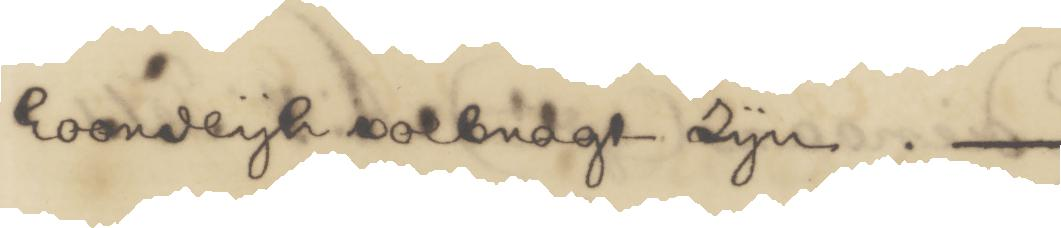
hoorelijk volbragt Zijn. —
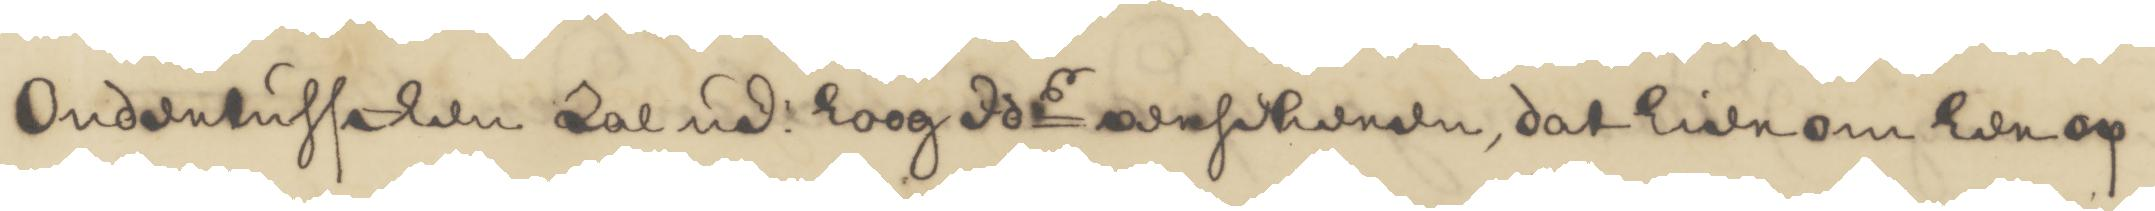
Ondertusschen zal uE: hoog Ed=s versekeren, dat hier om her op
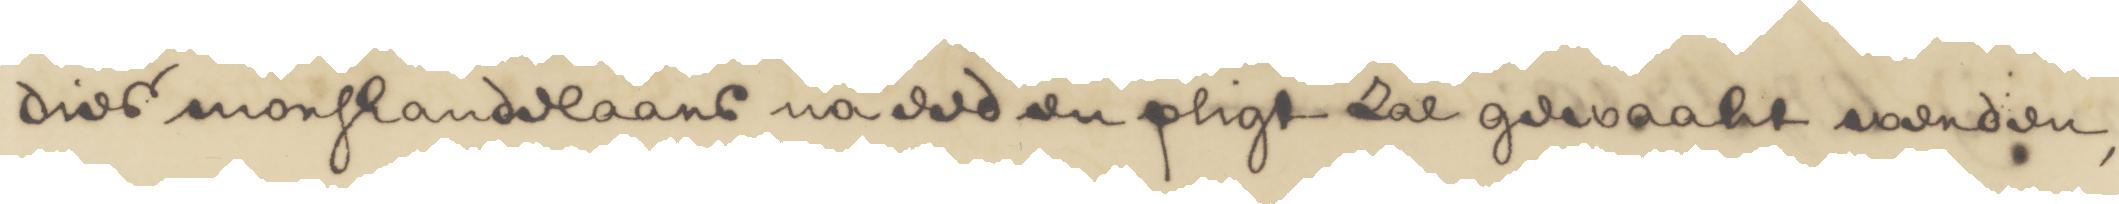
dies morshandelaars na eed en pligt zal gewaakt werden,
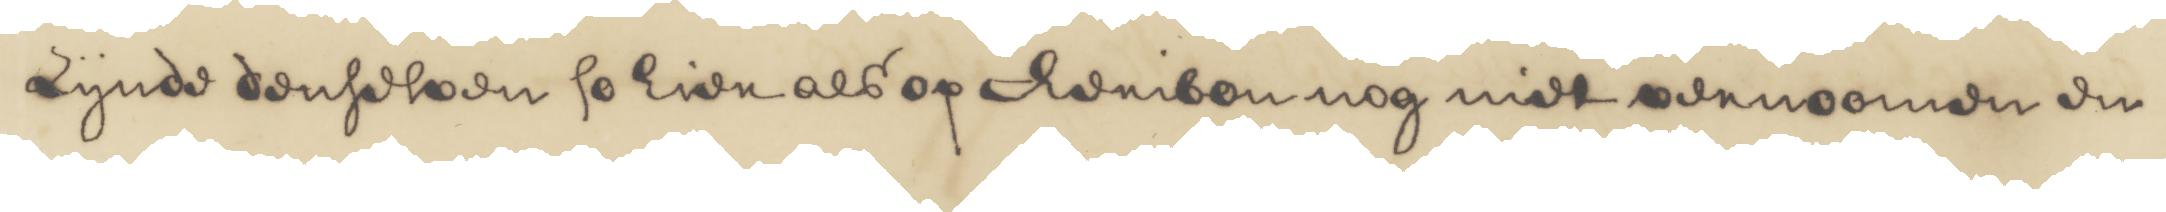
Zijnde denselven so hier als op cheribon nog niet vernoomen en
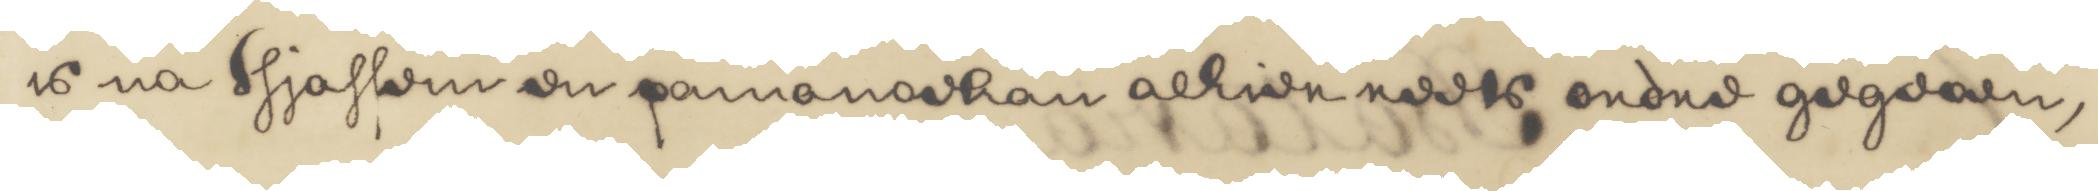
is na tsjassem en pamanoekan alhier reets ordre gegeven,
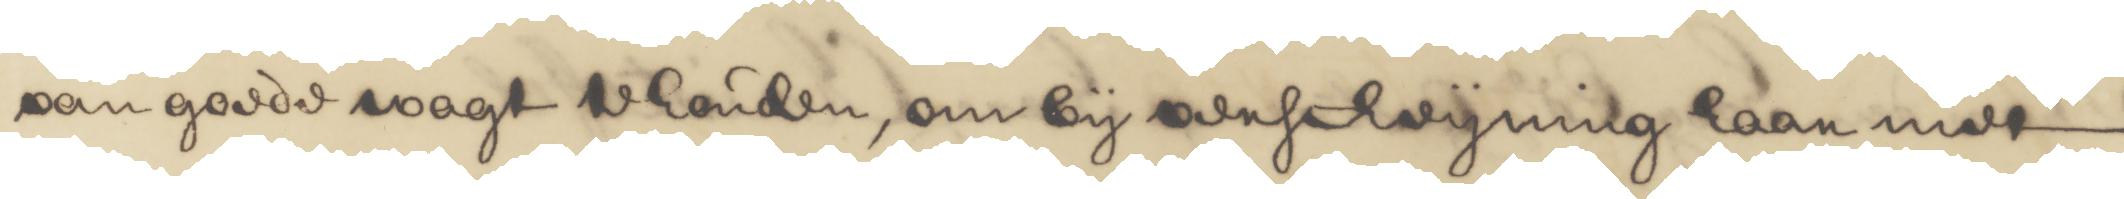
van goede wagt tehouden, om bij verscheijning haar niet
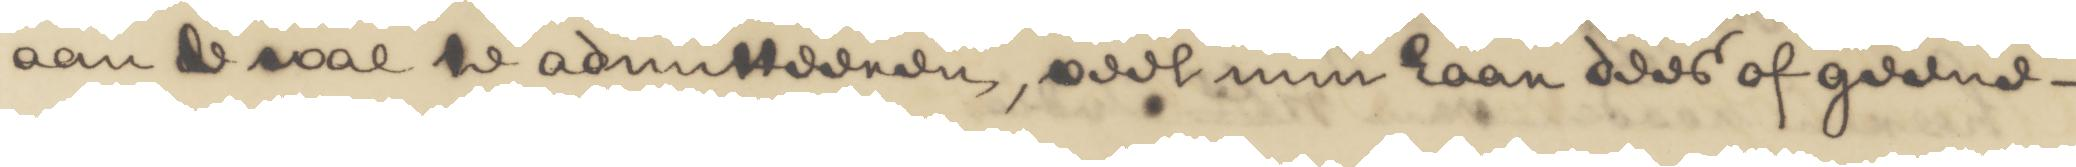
aan de wal te admitteeren, veel min haar dees of geene
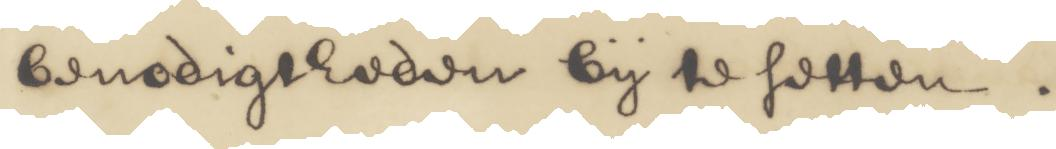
benodigtheden bij te setten.
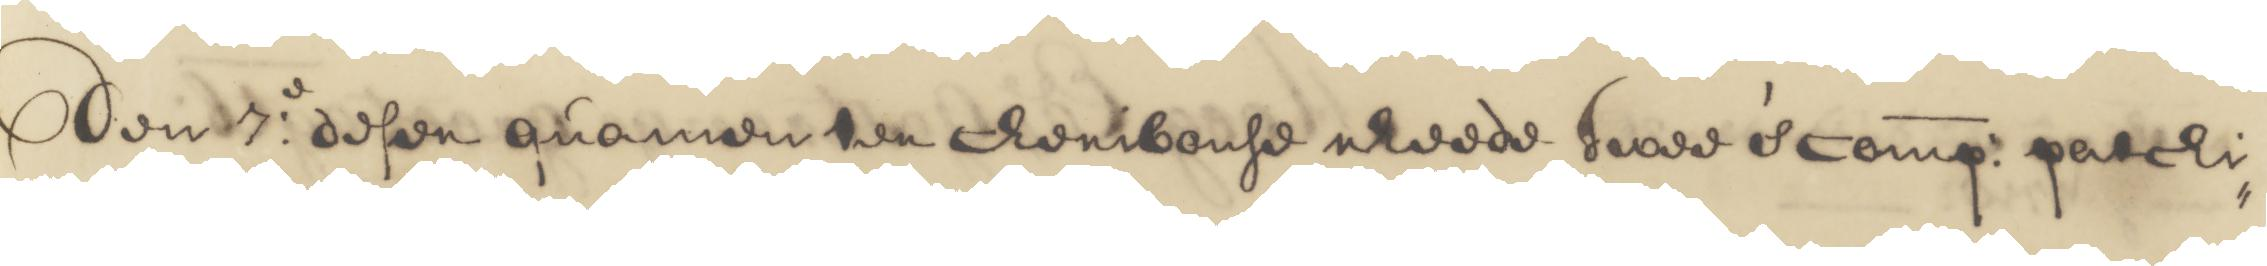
den 7:e deser quamen ter cheribonse rheede twee ’s comp: patchi„
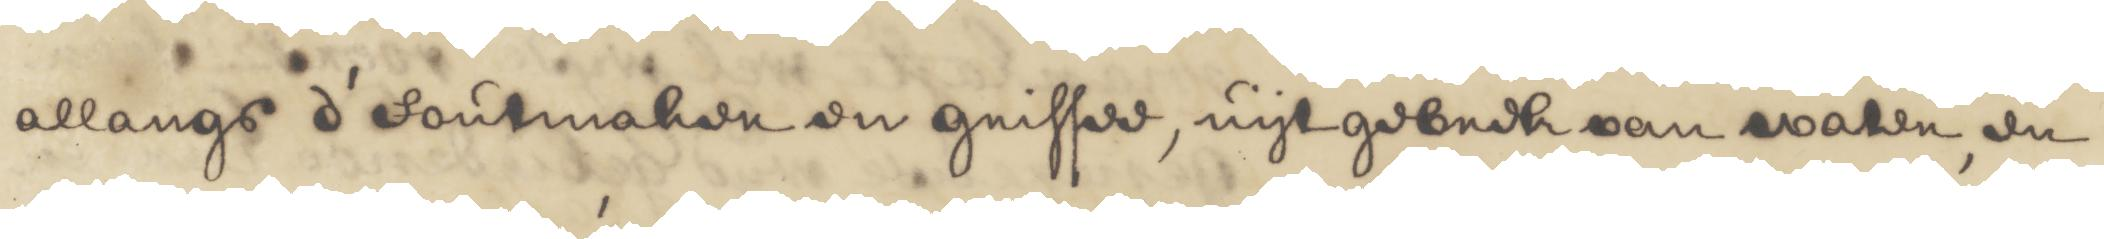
allangs d’ soutmaker en grissee, uijt gebrek van water, en
